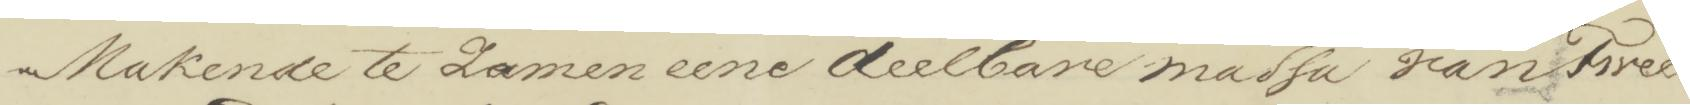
Makende te Zamen eene deelbare massa van Twee
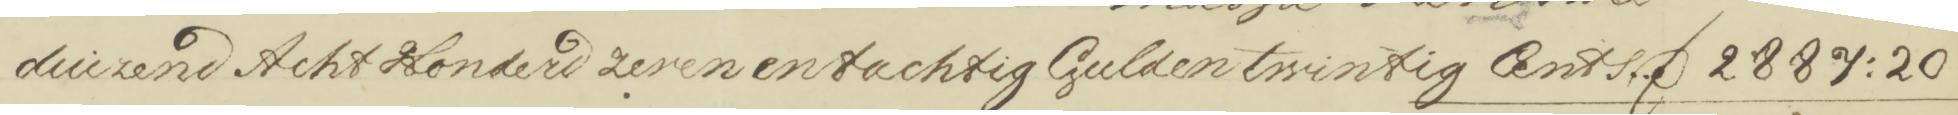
duizend Acht Honderd zeven en tachtig Gulden twintig Cents. .ƒ 2887:20
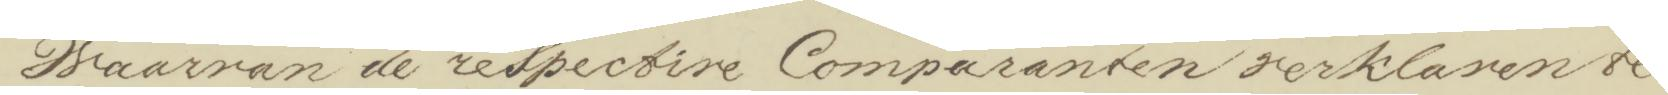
Waarvan de respective Comparanten verklaren te
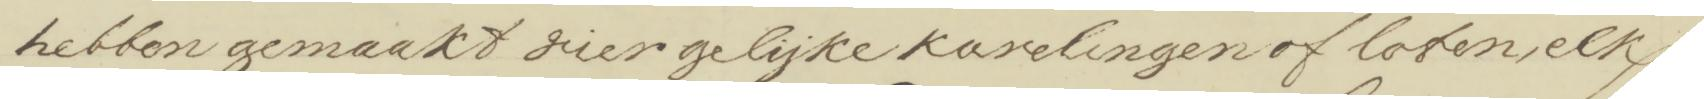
hebben gemaakt vier gelijke kavelingen of loten, elk
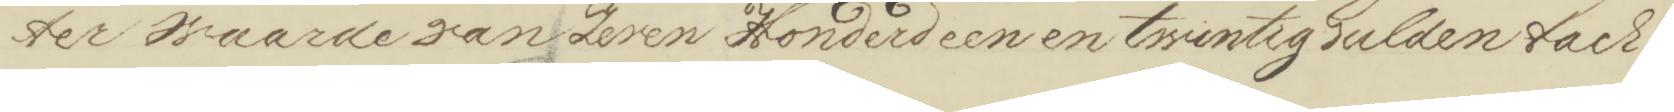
ter waarde van Zeven Honderd een en twintig Gulden tach
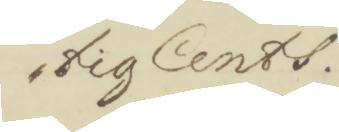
„tig Cents.
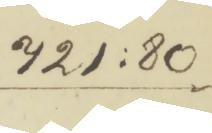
721:80.
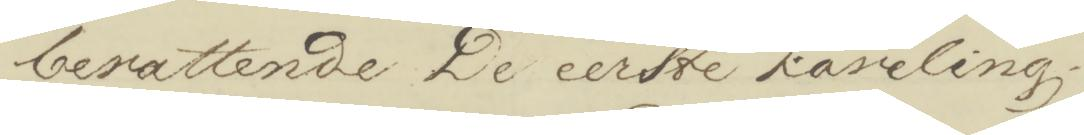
bevattende De eerste kaveling
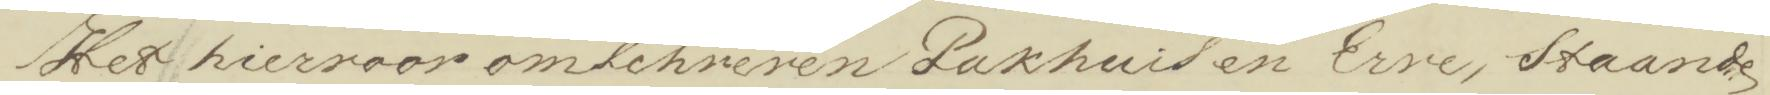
Het hiervoor omschreven Pakhuis en Erve, staande
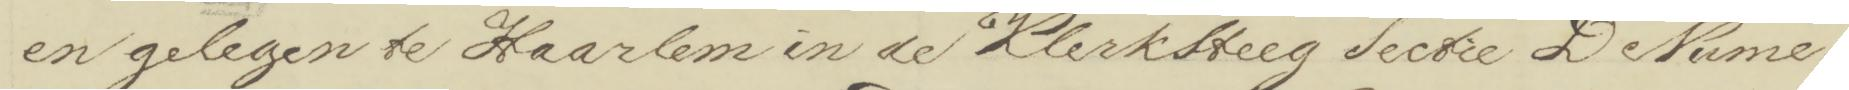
en gelegen te Haarlem in de Klerksteeg sectie D Nume
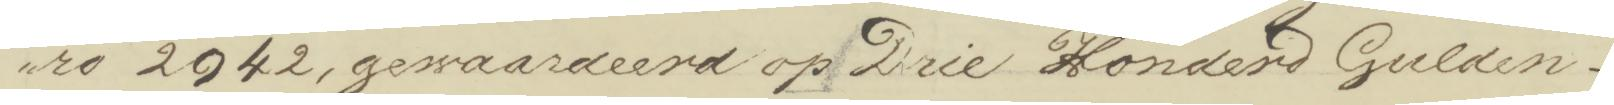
„ro 2942, gewaardeerd op Drie Honderd Gulden.
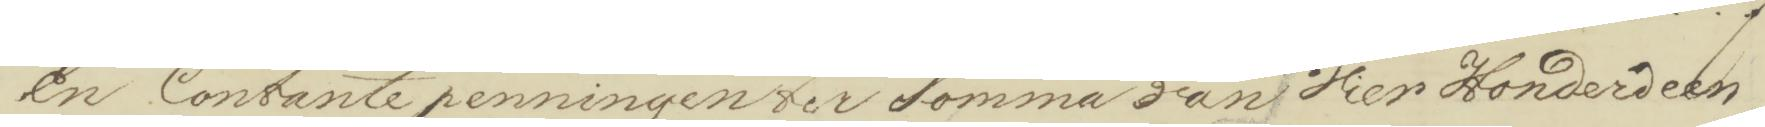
En Contante penningen ter somma van Vier Honderd een
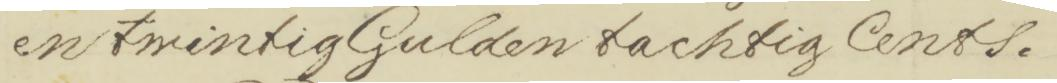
en twintig Gulden tachtig Cents.
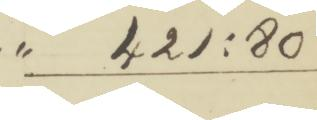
„ 421:80
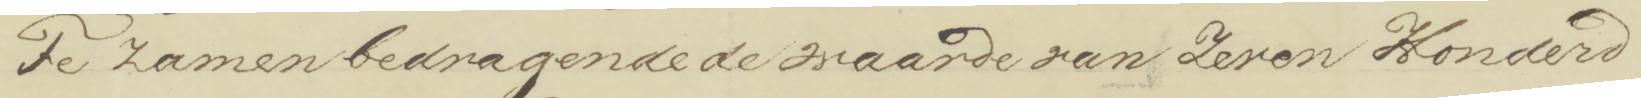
Te zamen bedragende de waarde van Zeven Honderd
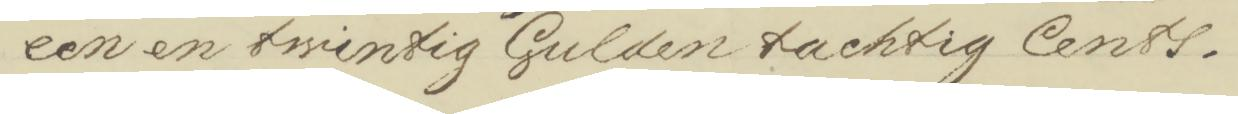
een en twintig Gulden tachtig Cents.
